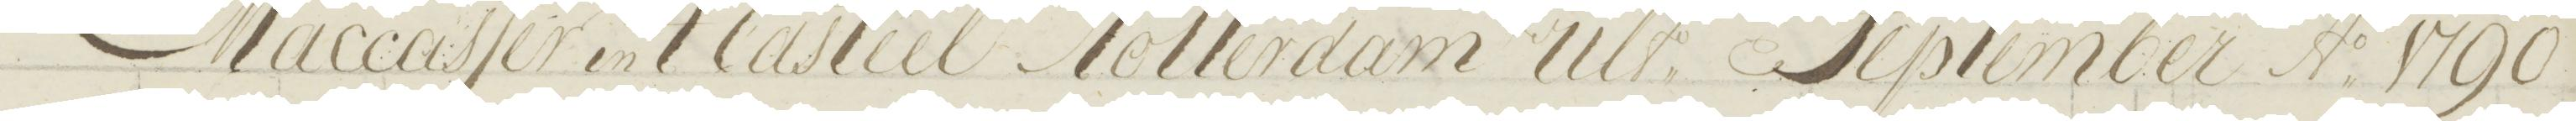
Maccasser in ’t Casteel Rotterdam Ult„o September A„o 1790
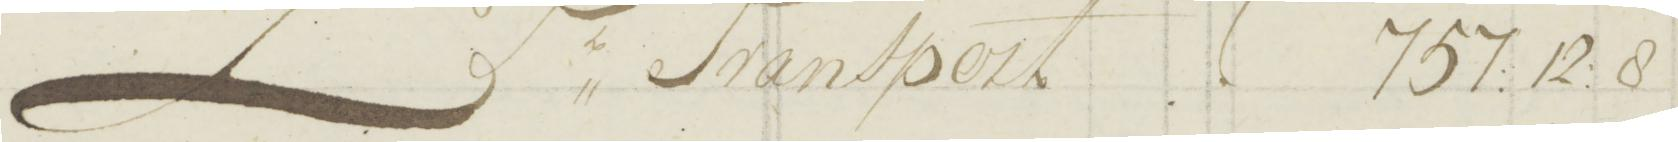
P„r Transport ƒ 757: 12: 8
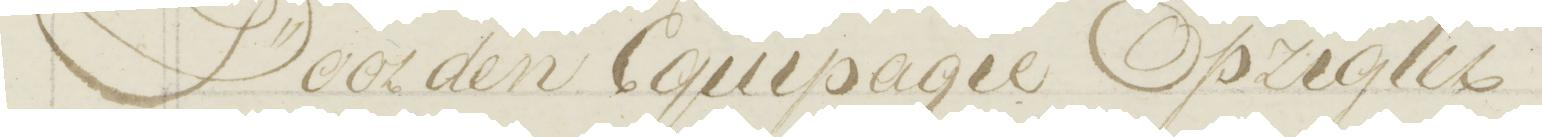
Door den Equipagie Opzigter
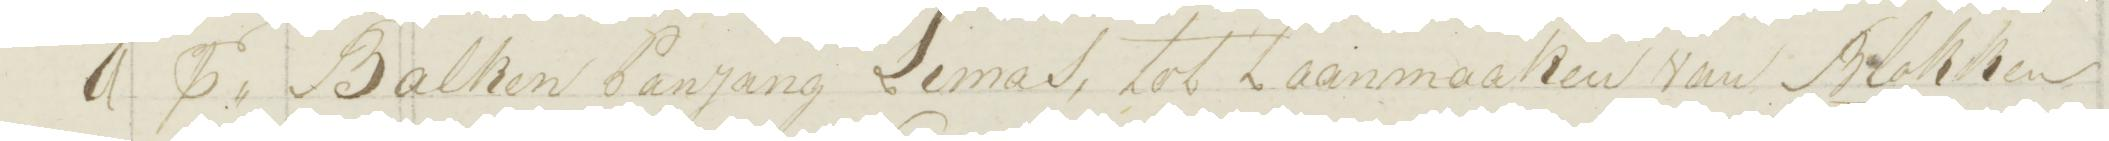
4 p„s Balken Panjang Limas, tot 't aanmaaken van Blokken
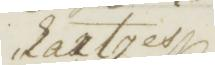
„hartjes
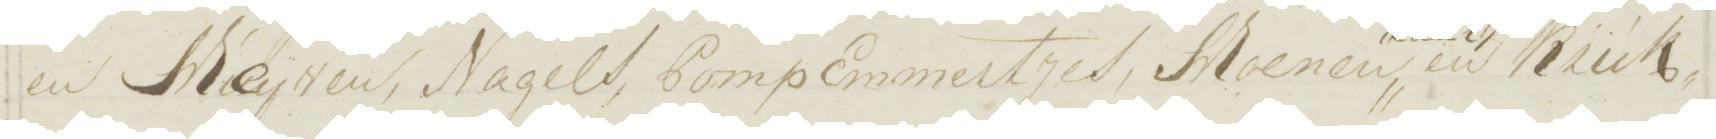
en scheijven, Nagels, Pomp Emmertjes, schoenen„ en kruk„
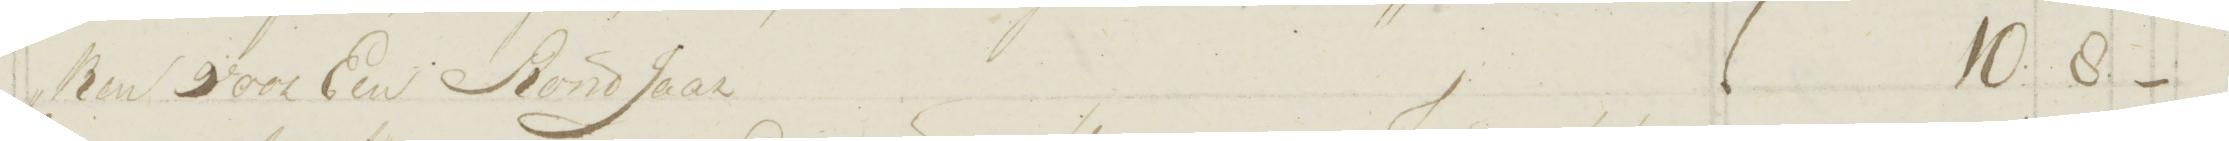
„ken voor Een Rond Jaar ƒ 10: 8: —
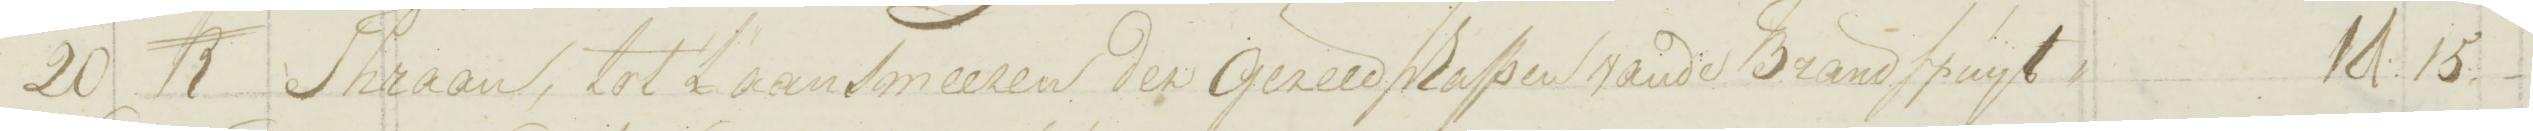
20 R Thraan, tot 't aansmeeren der gereedschappen vande Brandspuijt „ 14: 15: —
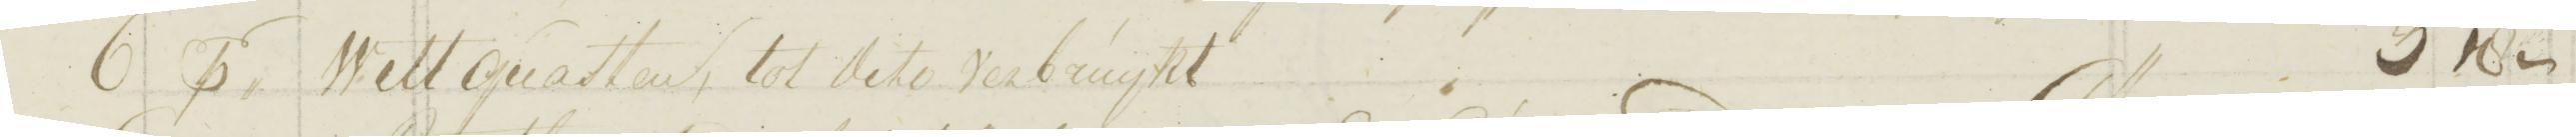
6 p„s Witt quasten, tot dito verbruijkt „ 3 18 —
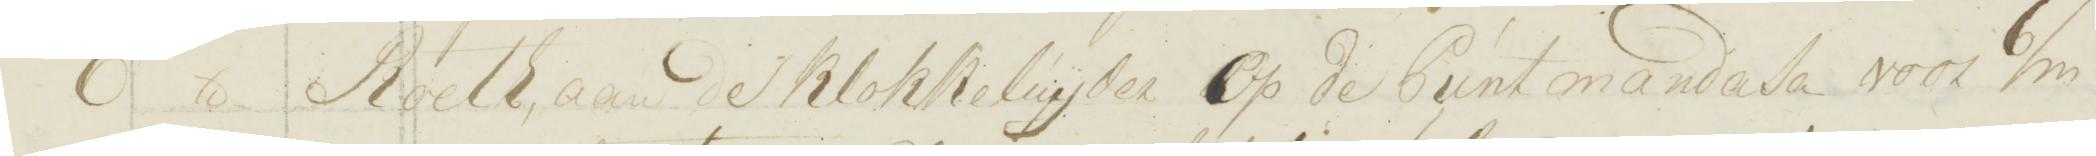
6 lb Roeth, aan de klokkeluijder Op de Punt mandasa voor 6/m
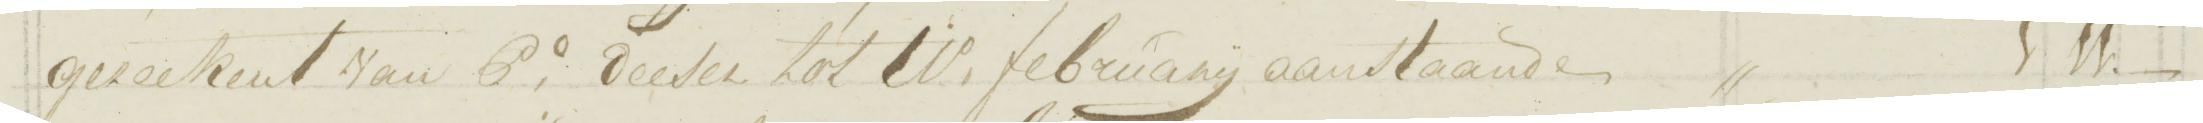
gereekent van P„o deeser tot U„o februarij aanstaande „ 1 11: —
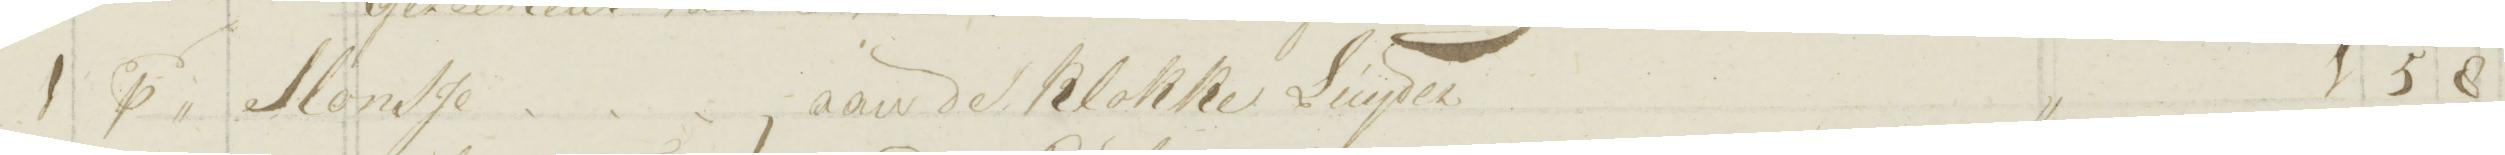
1 p„s Slonsje , , , aan de Klokke Luijder „ 1 5 8
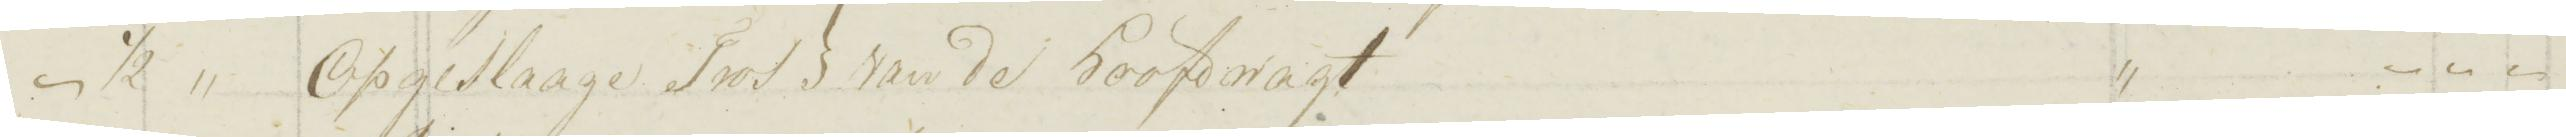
— ½ „ Opgeslaage Tros van de hoofdwagt „ — — —
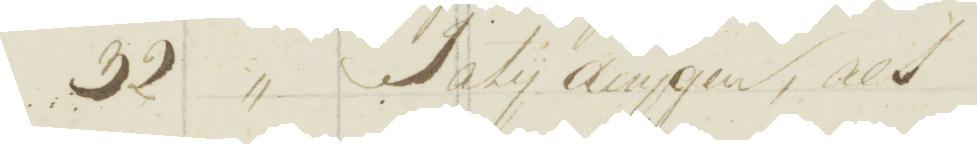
32 „ Iatij duijgen, als
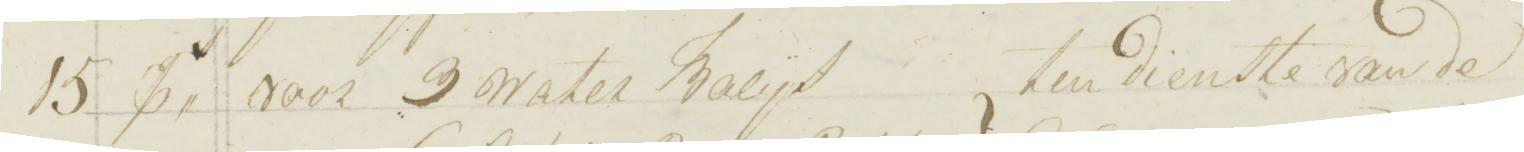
15 p„s voor 3 water Balijs ten dienste van de
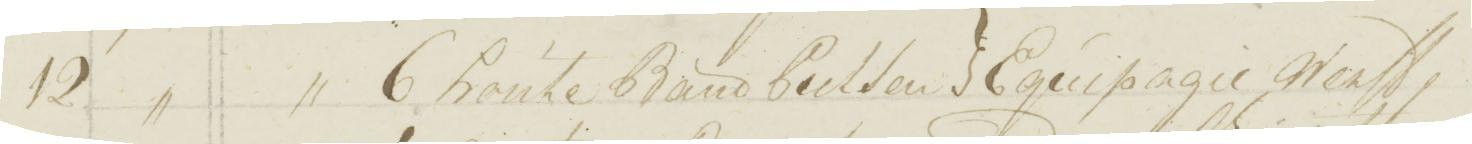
12 „ „ 6 houte Band Pulsen Equipagie werff,
